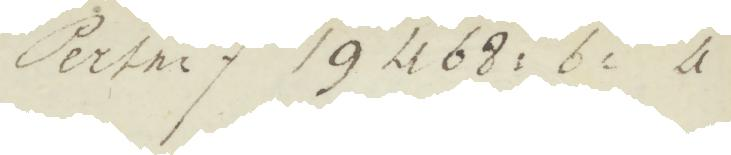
Per tr: ƒ 19468: 6: 4
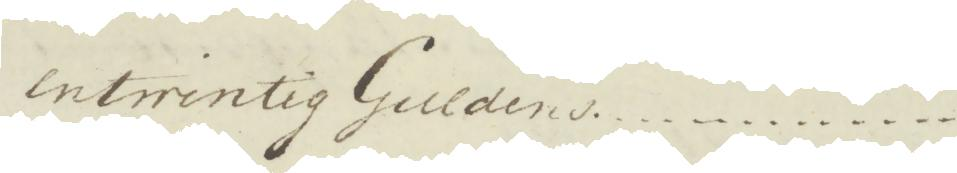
en twintig Guldens. . . . . . . . . .
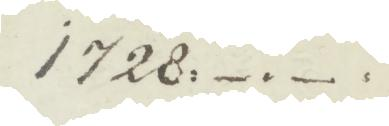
1728:—.— :
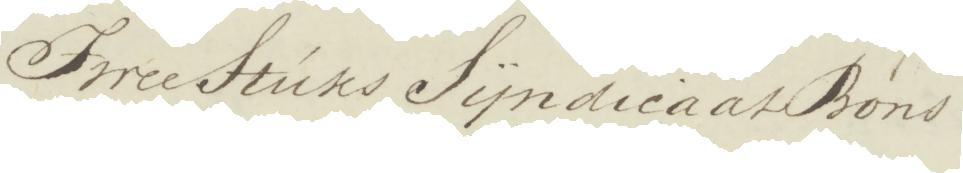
Twee stuks sijndicaat Bons
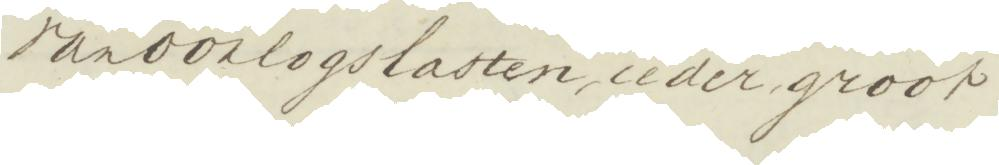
van oorlogslasten, ieder, groot
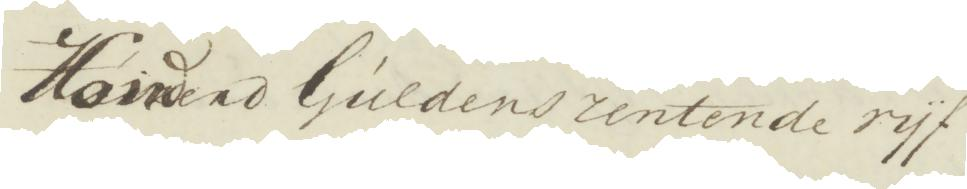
Honderd Guldens rentende vijf
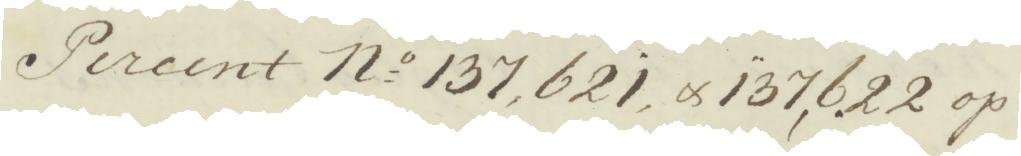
Percent N=o 137,621, & 137,622 op
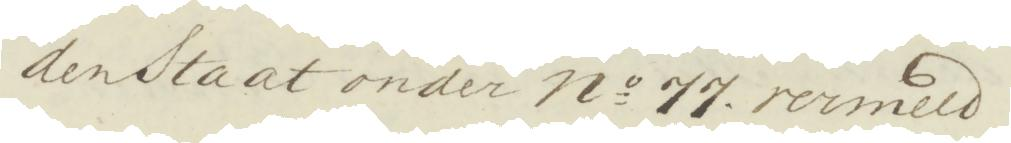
den staat onder N=o 77. vermeld
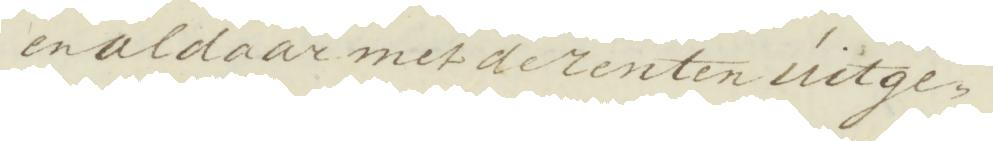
en aldaar met de renten uitge„
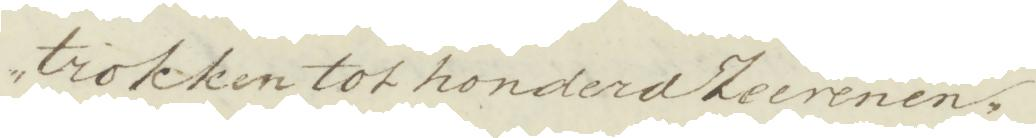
„trokken tot honderd zeevenen„
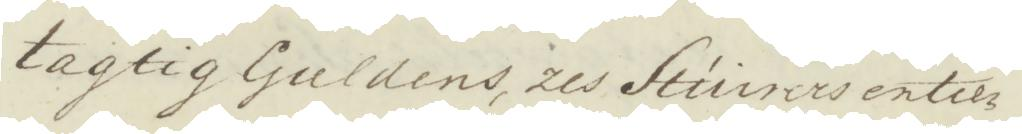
tagtig Guldens, zes stuivers en tien
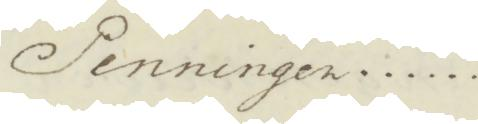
Penningen. . . . .
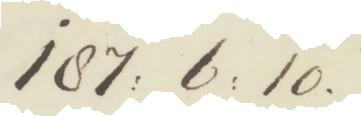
187: 6:10.
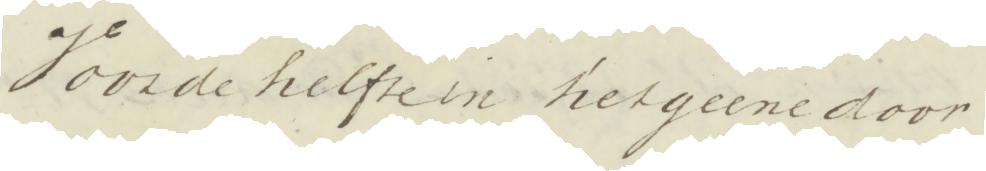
Voor de helfte in hetgeene door
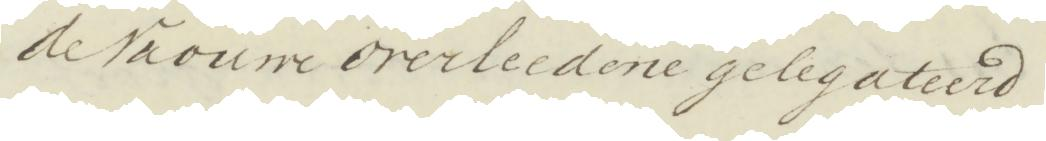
de Vrouwe overleedene gelegateerd
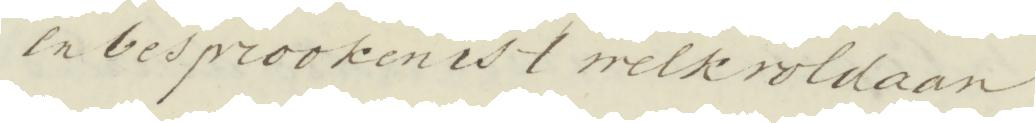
en besprooken is 't welk voldaan
